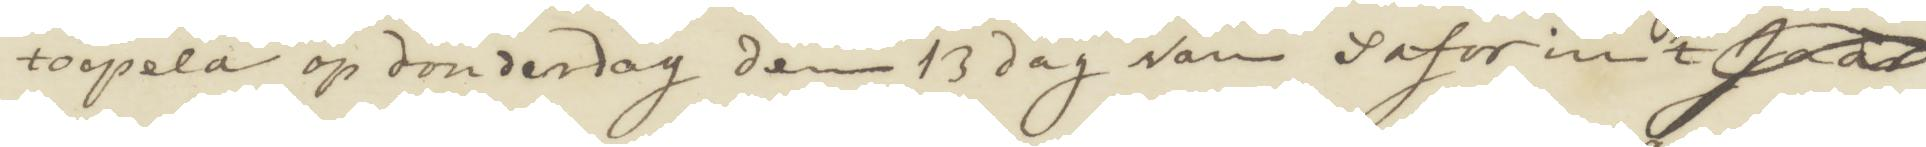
toepela op donderdag den 13 dag van safor in ’t Jaar
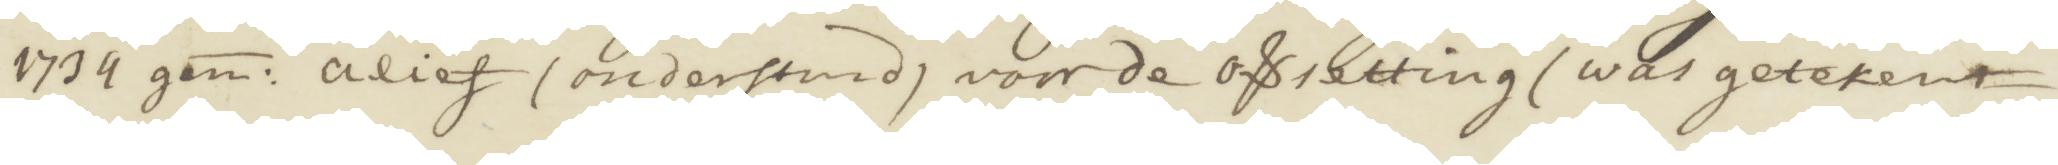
1734 gen: alief (onderstond) voor de oversetting (was getekent
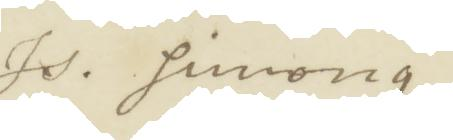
Js. Simong
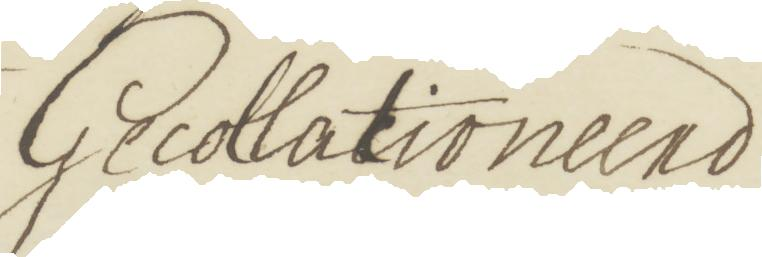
Gecollationeerd
